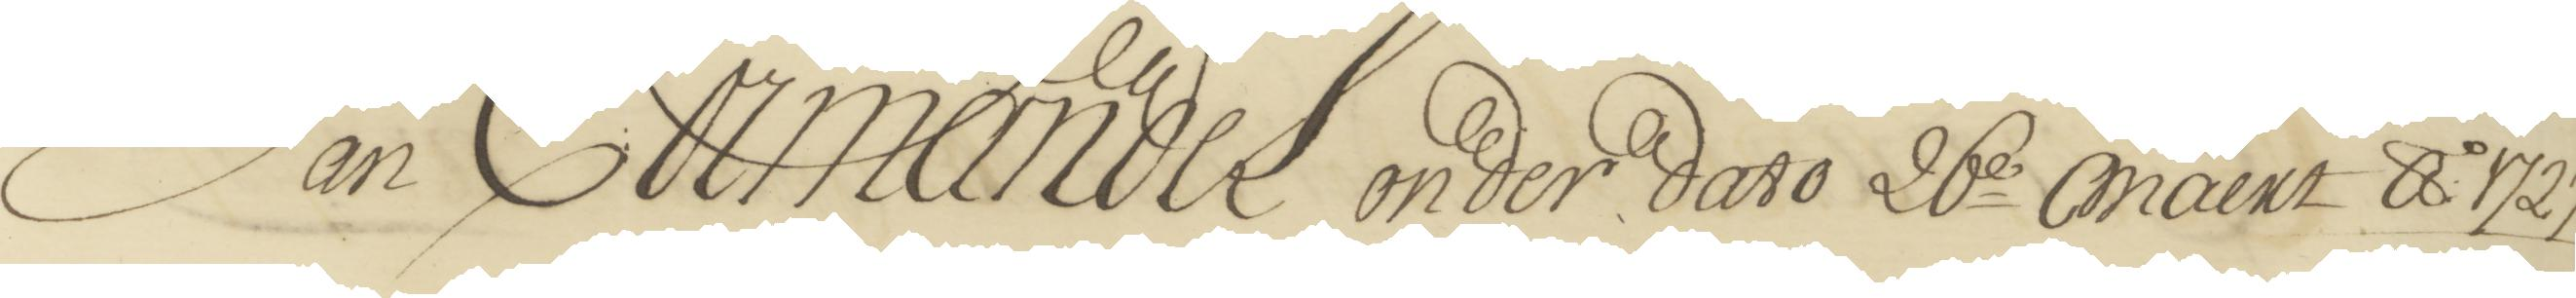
Van Cormandel onder dato 26=e maert A:o 1727
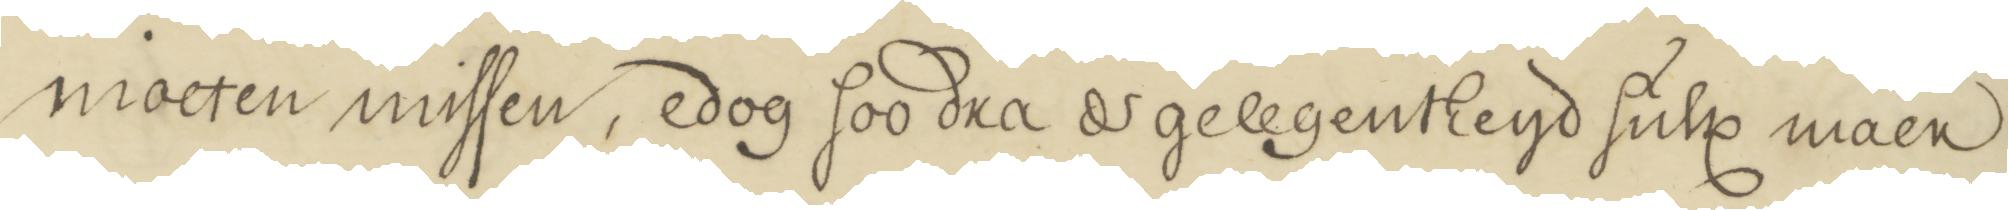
moeten missen, edog soo dra de gelegentheyd sulx maer
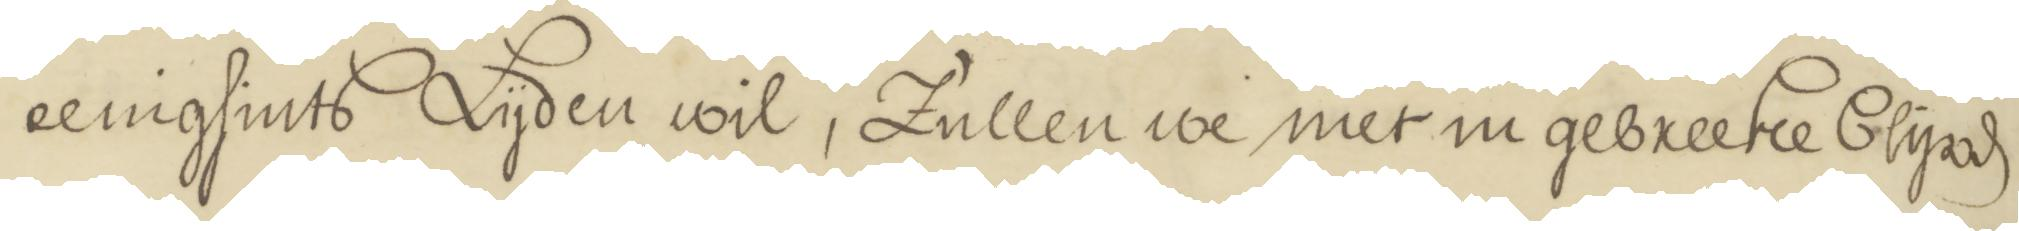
eenigsints Lijden wil, Zullen we niet in gebreeke blijven
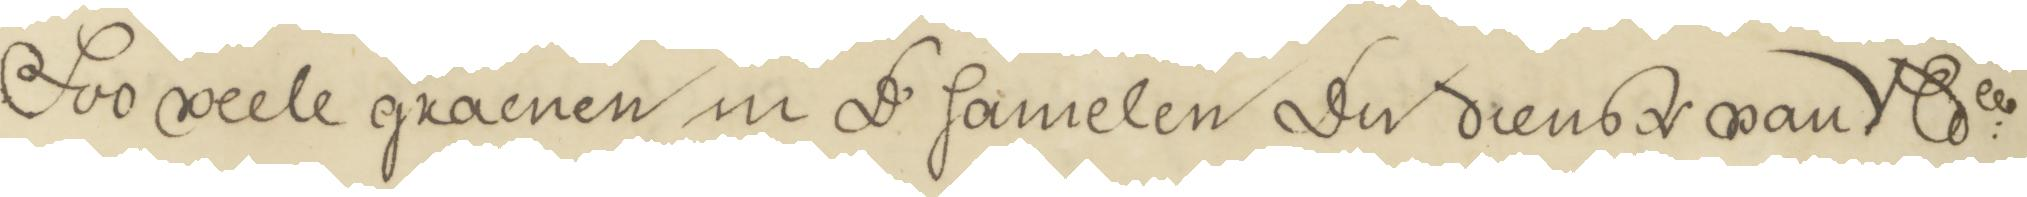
soo veele graenen in te samelen ten dienste van VEd:le
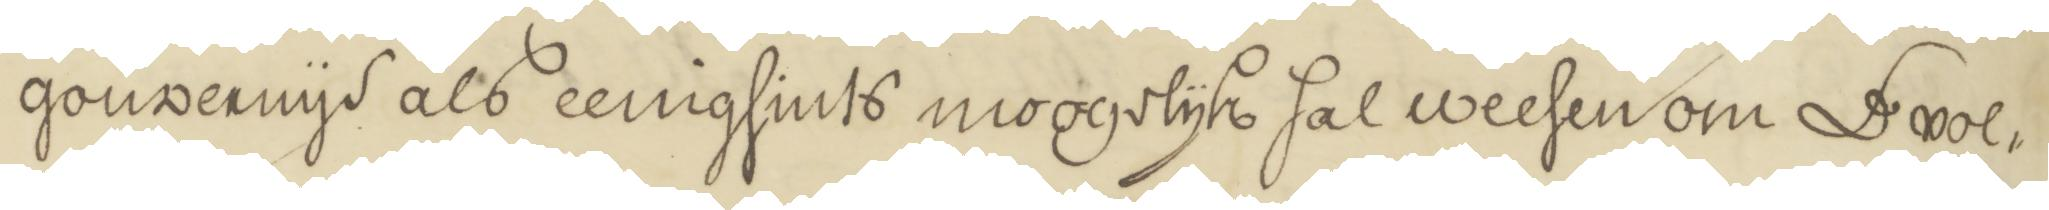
gouvernije als eenigsints moogelijk sal weesen om te vol„
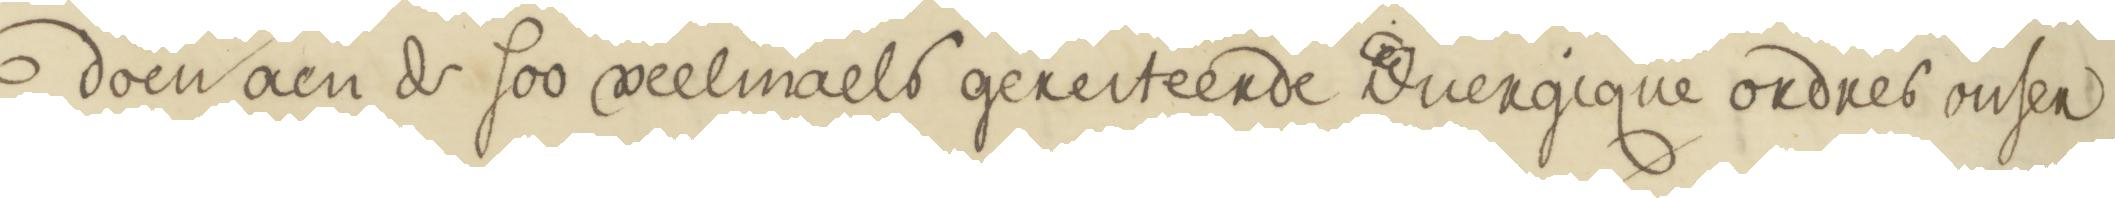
doen aen de soo veelmaels geresteerde Energique ordres onser
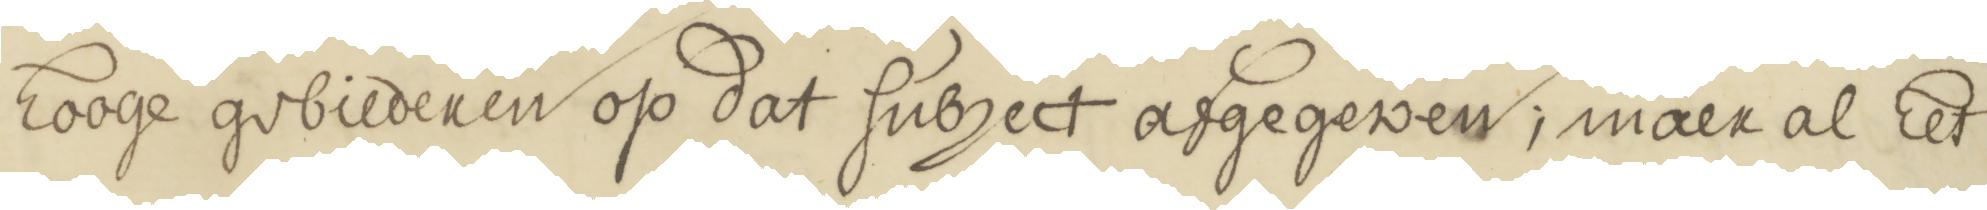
hooge gebiederen op dat subject afgegeven; maer al het
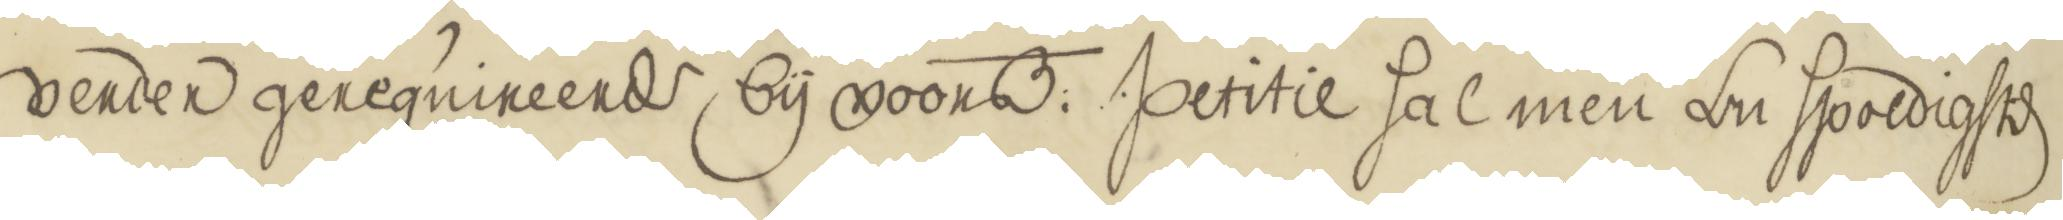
verder gerequireerde bij voorsz: petitie sal men ten spoedigsten
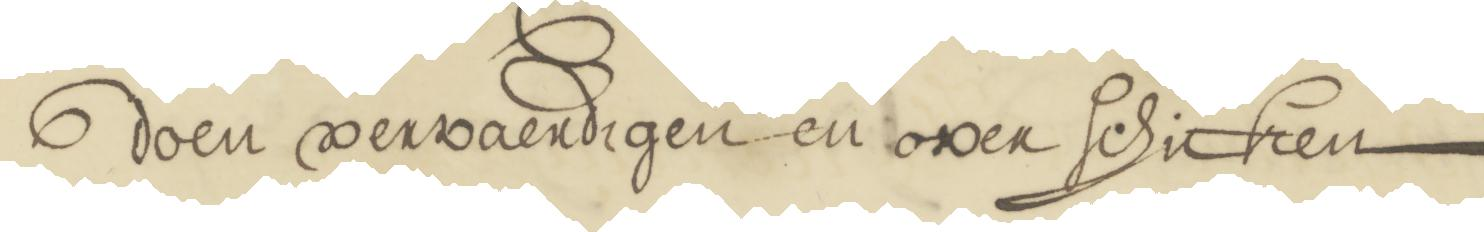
doen vervaerdigen en over schicken.
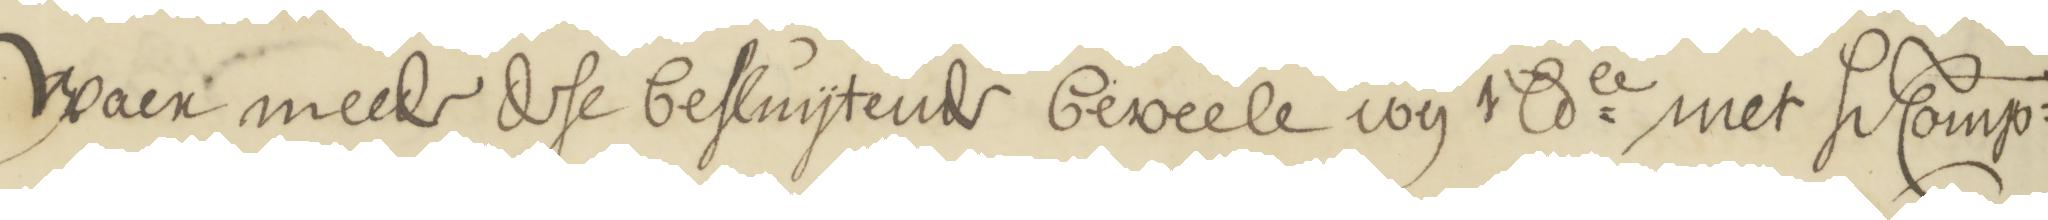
Waer meede dese besluijtende beveele wij VEd=le met 'S EComp:
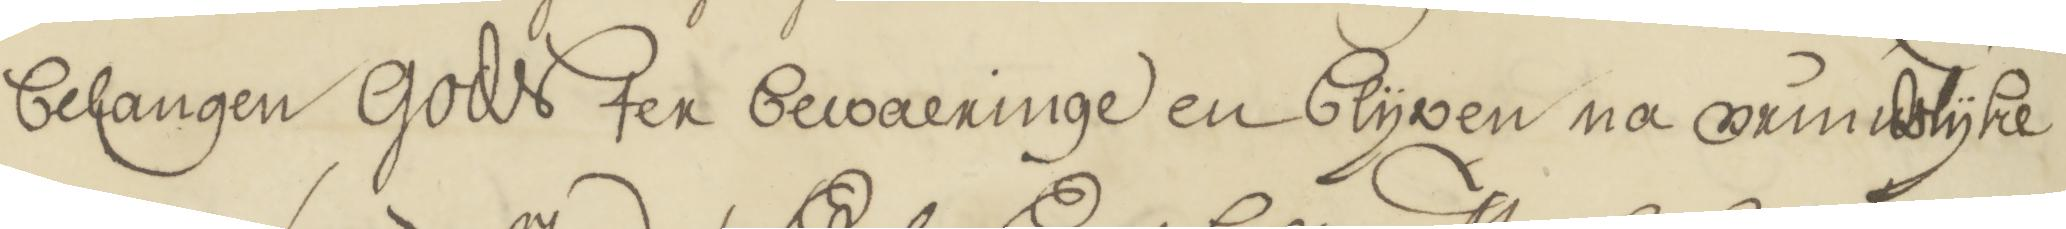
belangen Godes ter bewaeringe en blijven na vrundelijke
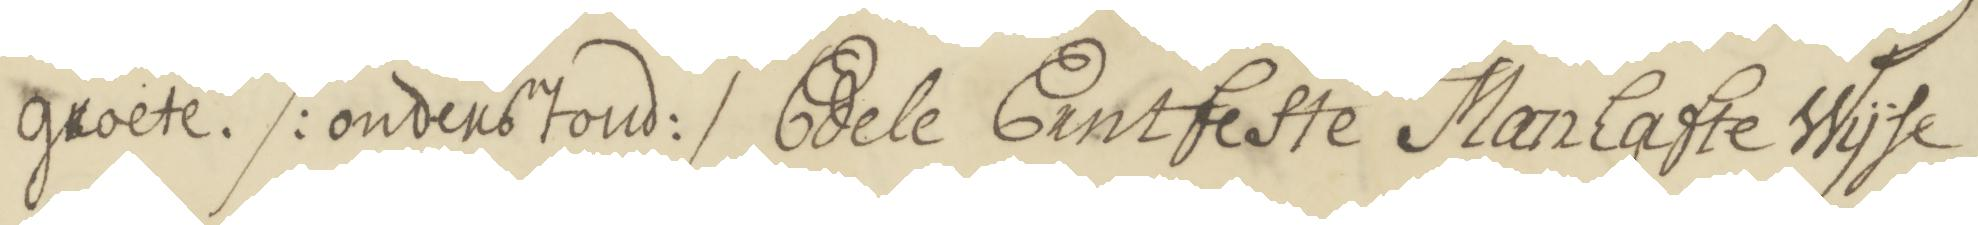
groete. /: onderstond:/ Edele Erntfeste Manhafte Wijse
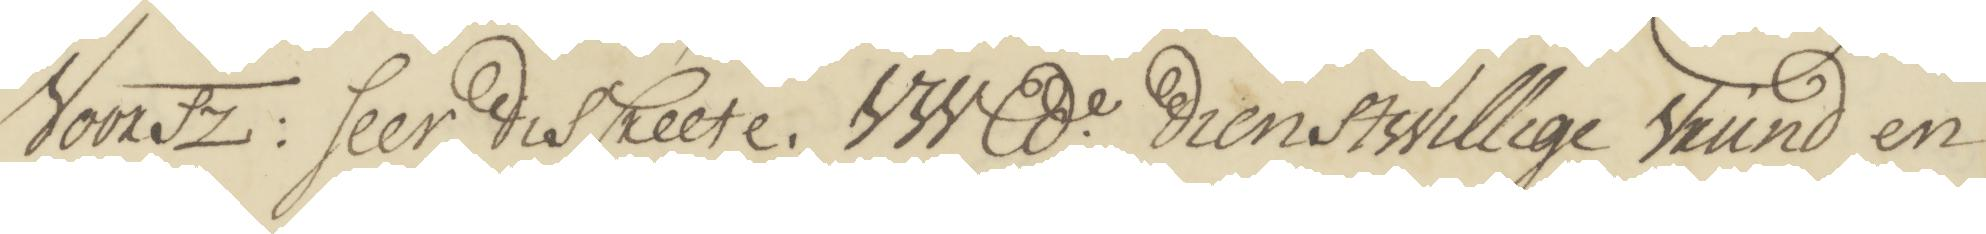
Voorsz: Seer discreete. VW Ed:e dienstwillige Vrund en
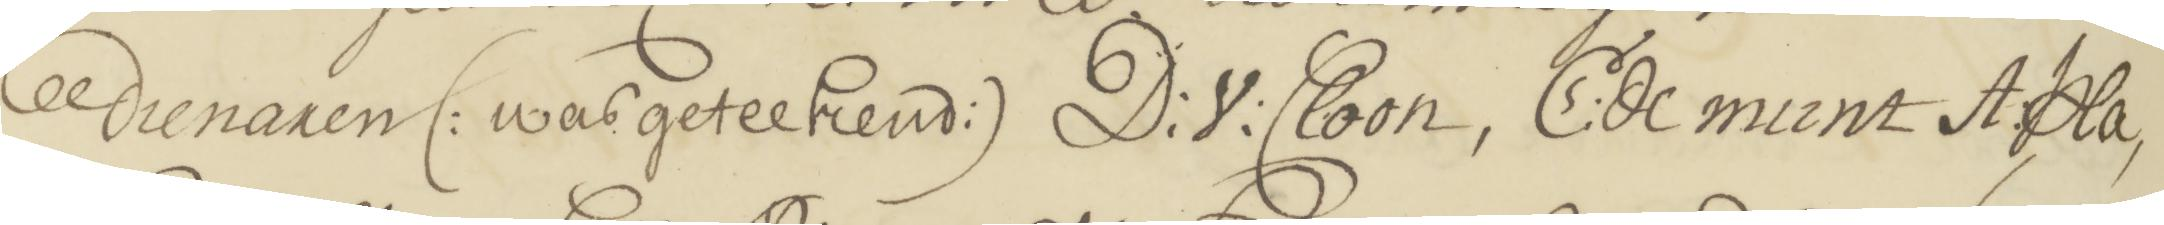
dienaren (:was geteekend:) D: V: Cloon, C: de munt A: Pla,
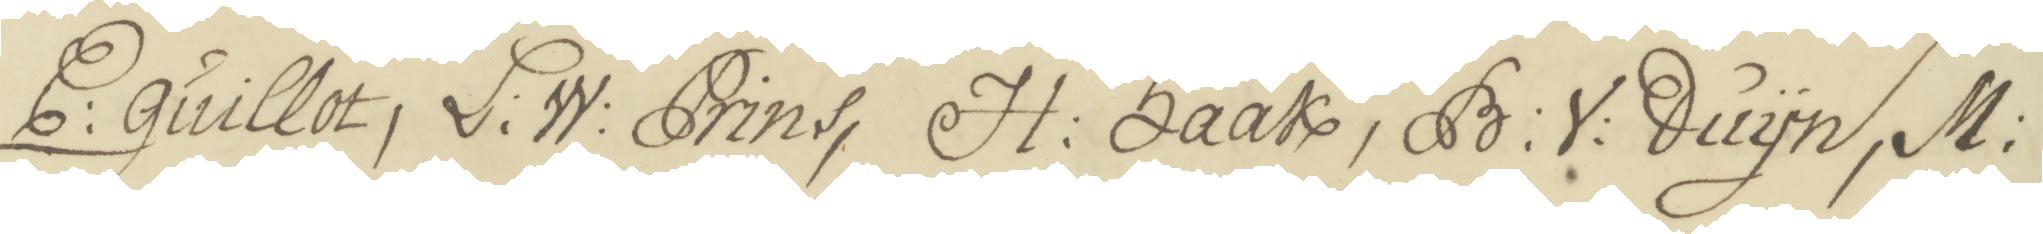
E: Guillot, L: W: Prins, H: haak, B: V: Duijn, M:
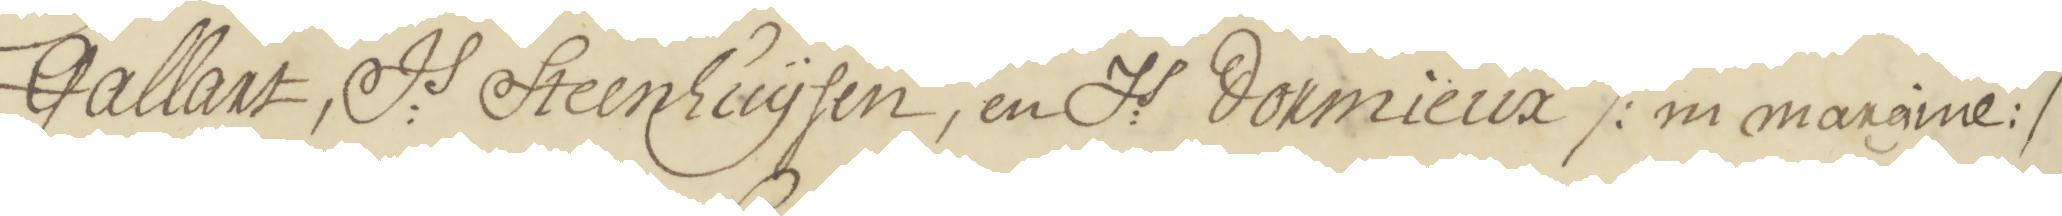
Gallart, I:s Steenhuijsen, en I:s dormieux /: in margine:/
